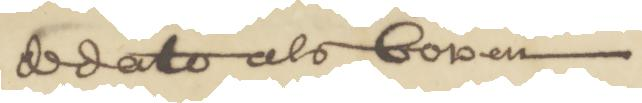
de dato als boven.
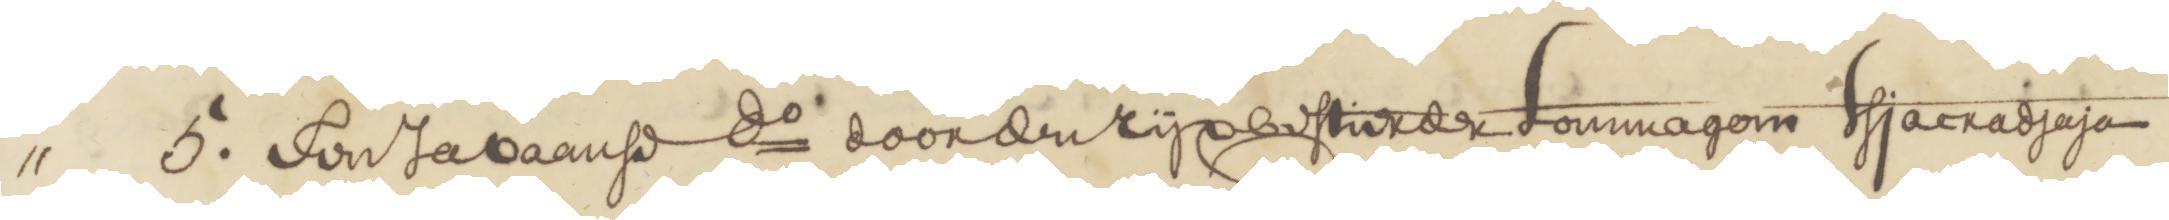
„ 5. Een Javaanse d=o door den rijxbestierder tommagom tsjacradjaja
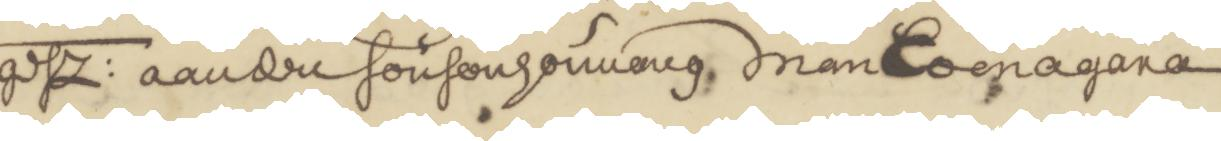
gesz: aan den sousouhounang mancoenagara
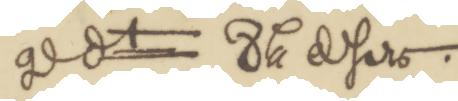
ged=t 8„' deses.
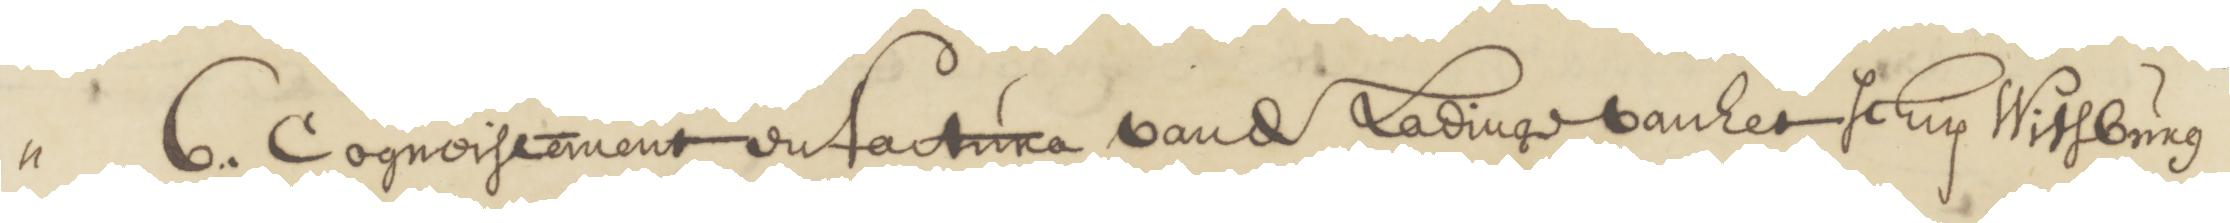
„ 6. Cognoiscement en factura van de Ladinge vanhet schip witsburg
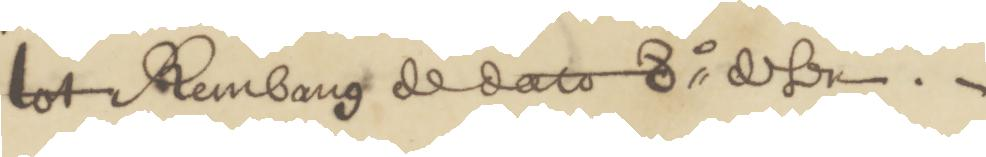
tot Rembang de dato 8„e deser. —
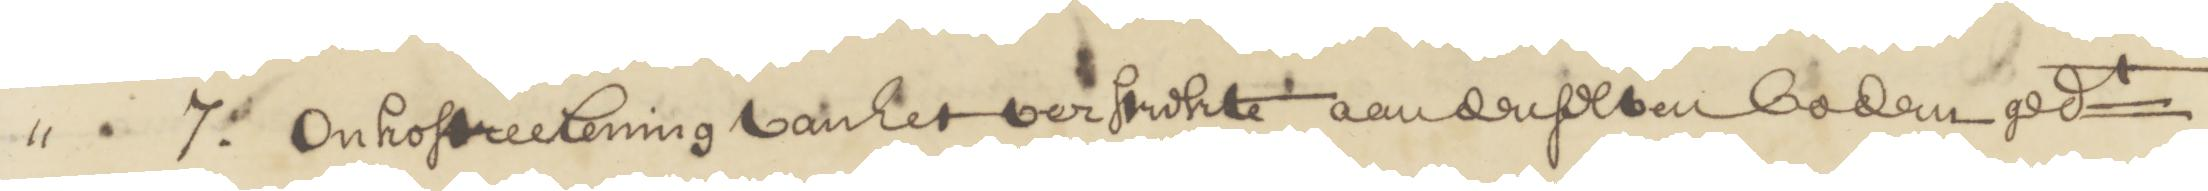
„ 7. Onkostreekening van het verstrekte aan denselven bodem ged=t
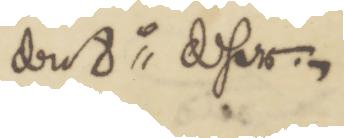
den 8„e deser. —
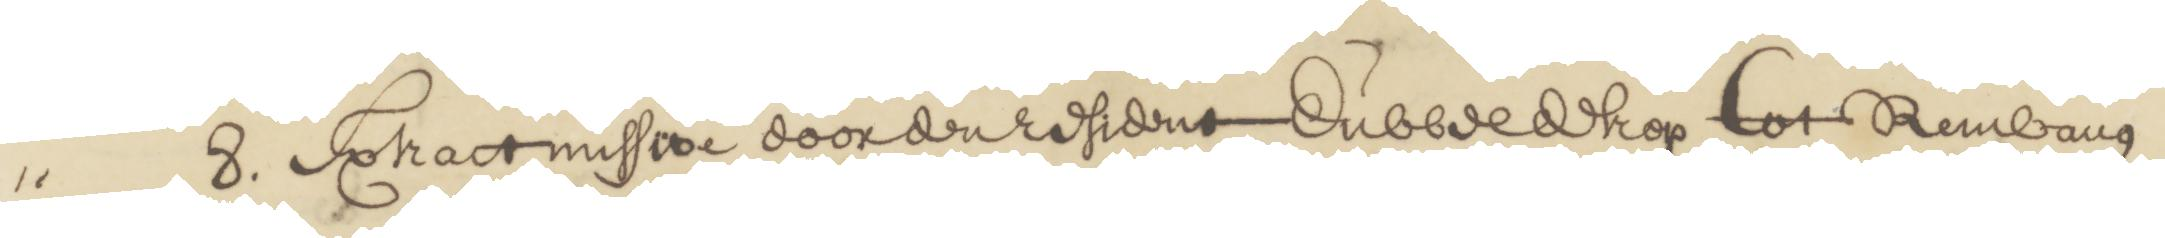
„ 8. Extract missive door den resident Dubbeldekop tot Rembang
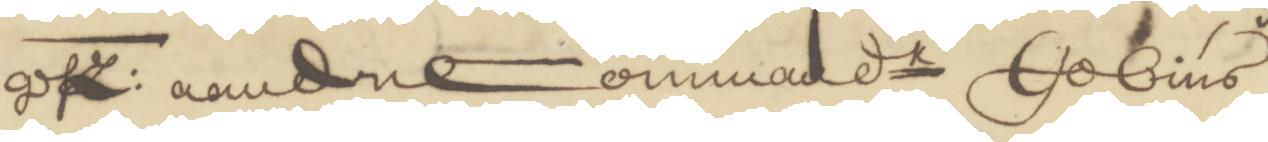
gesz: aan den command=r Gobius
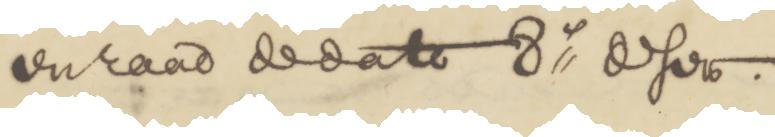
en raad de dato 8„e deser.
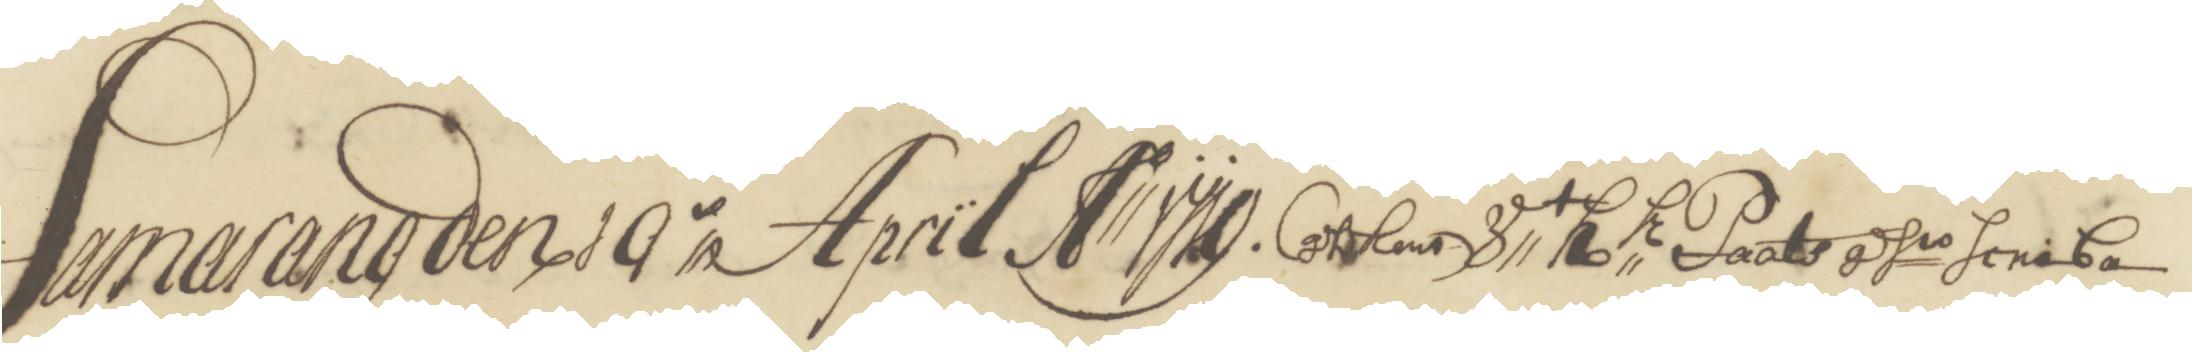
Samarang den 14„en April A„o 1719. (getekent) V„t h„k Paats ges=en scriba
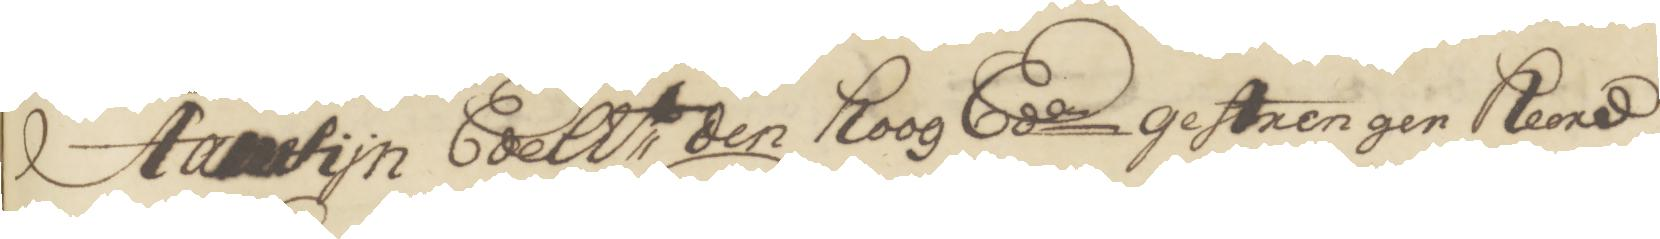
Aan sijn Edelh„t den hoog Ed=le gestrengen Heere
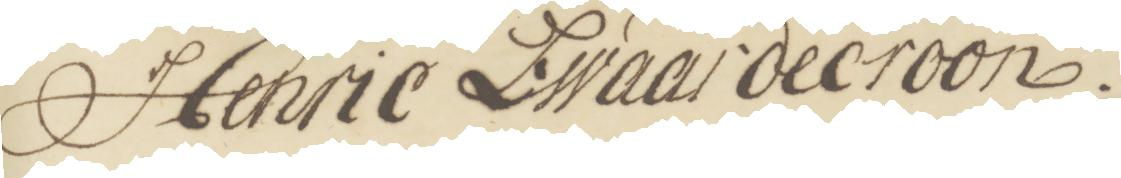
Henric Zwaar decroon.
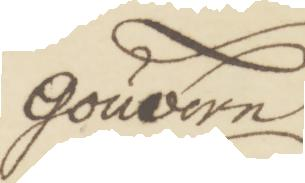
gouvern:
